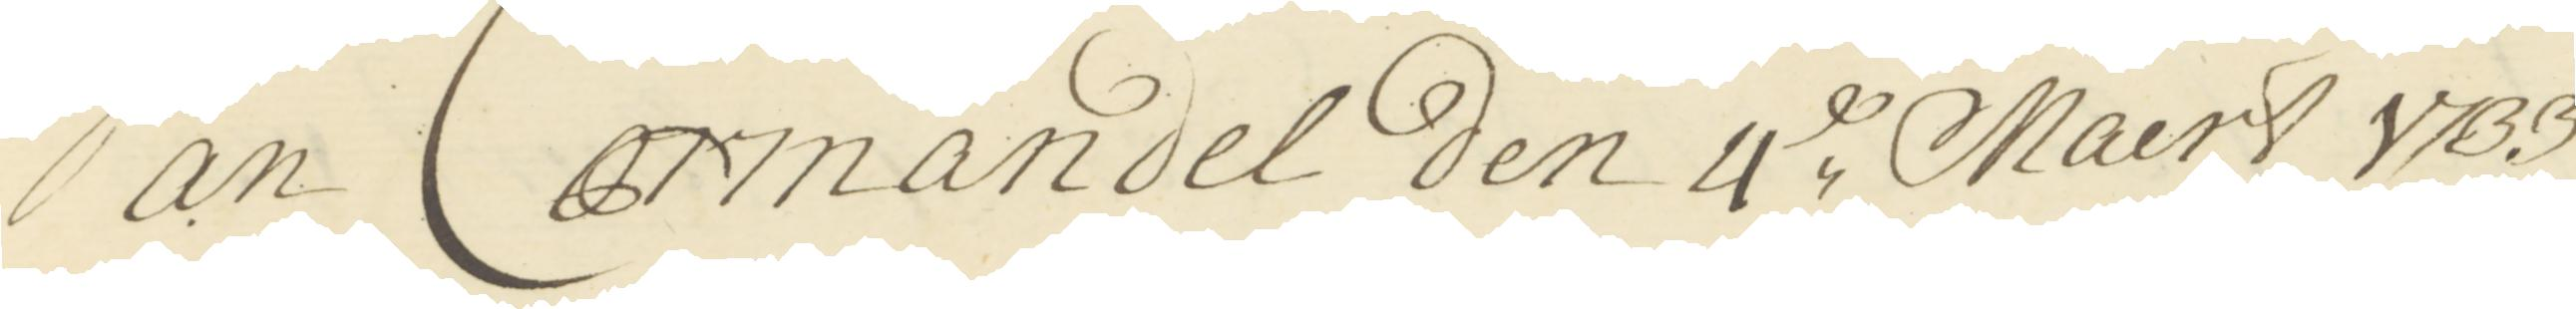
Van Cormandel den 4„e Maert 1733
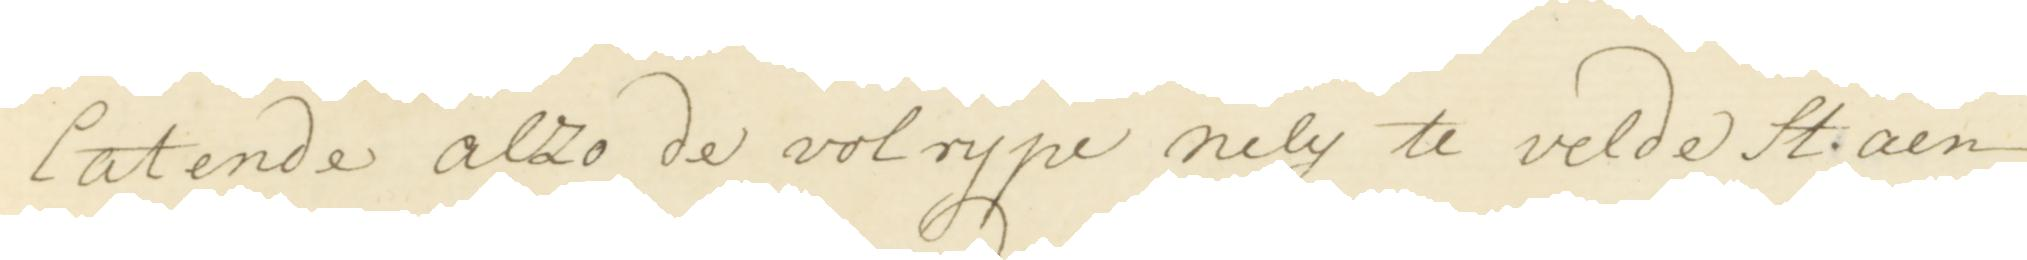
latende alzo de vol rype nely te velde st.aen
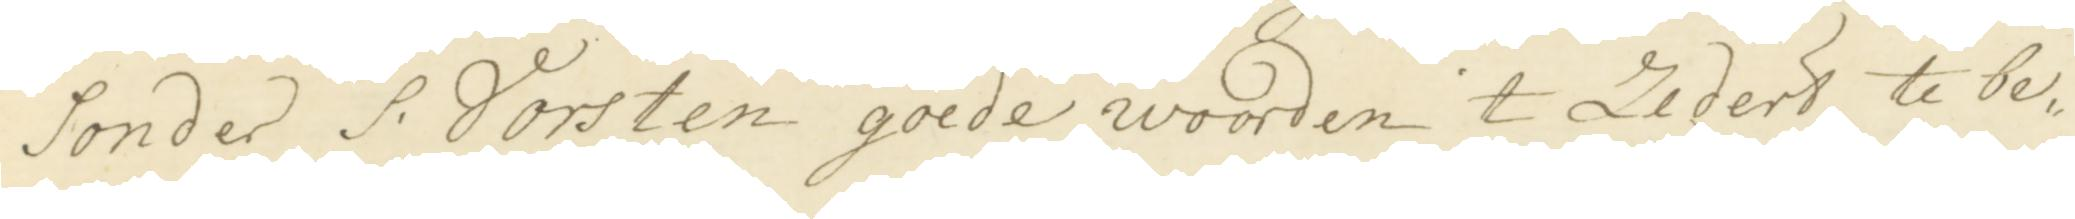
sonder s. Vorsten goede woorden ’t zedert te be„
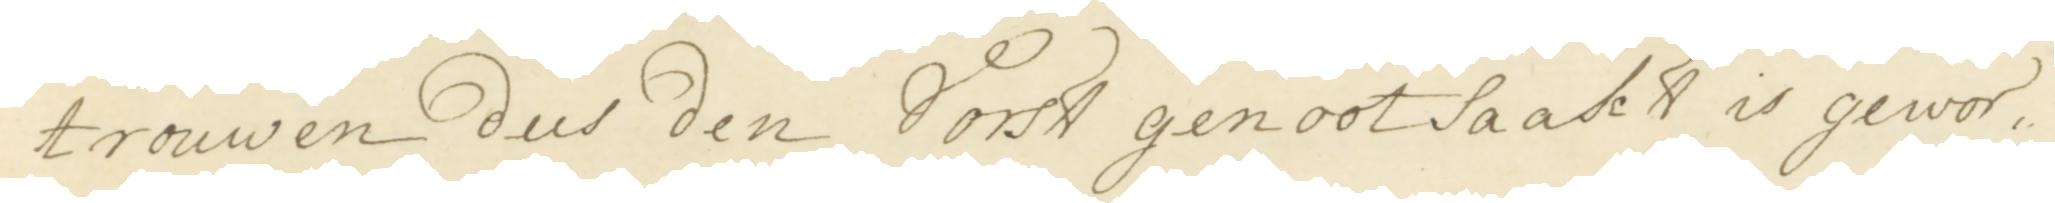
trouwen dus den Vorst genootsaakt is gewor„
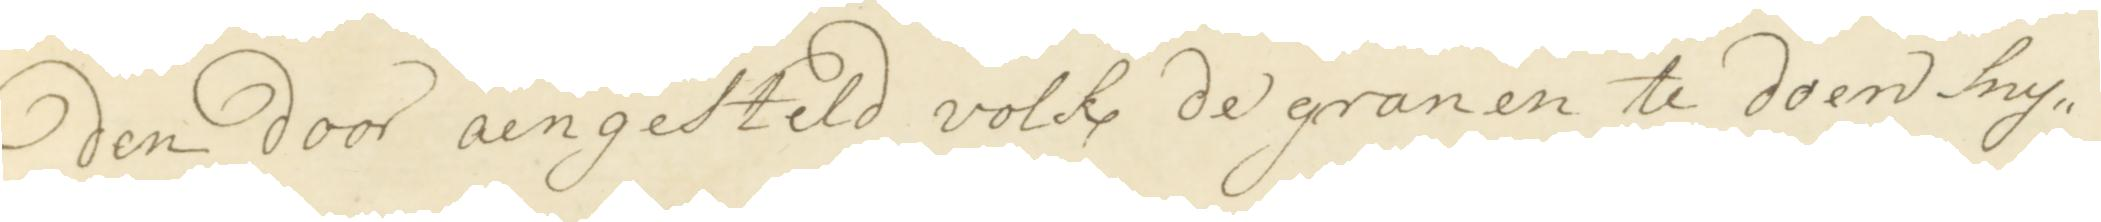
den door aengesteld volk de granen te doen sny„
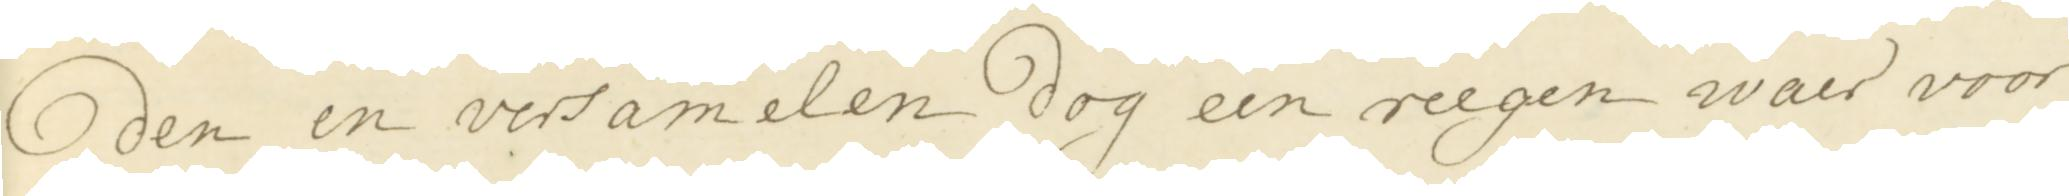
den en versamelen dog een reegen waer voor
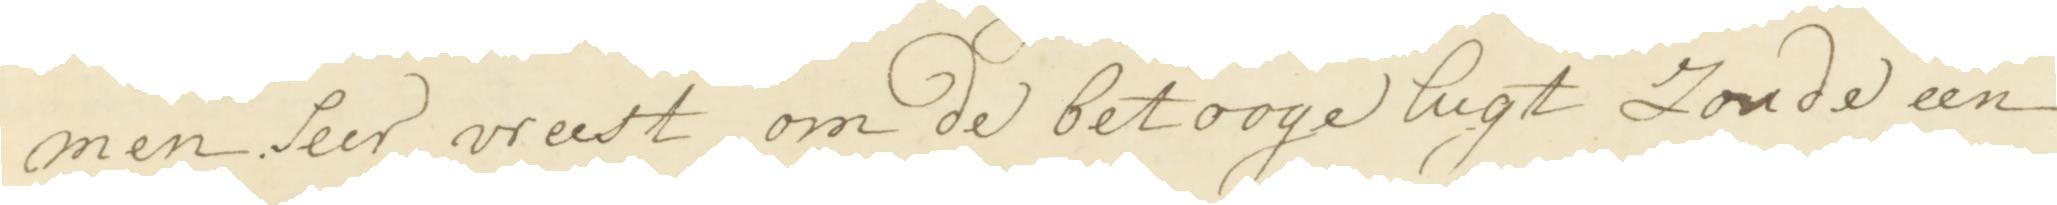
men seer vreest om de betooge lugt zoude een
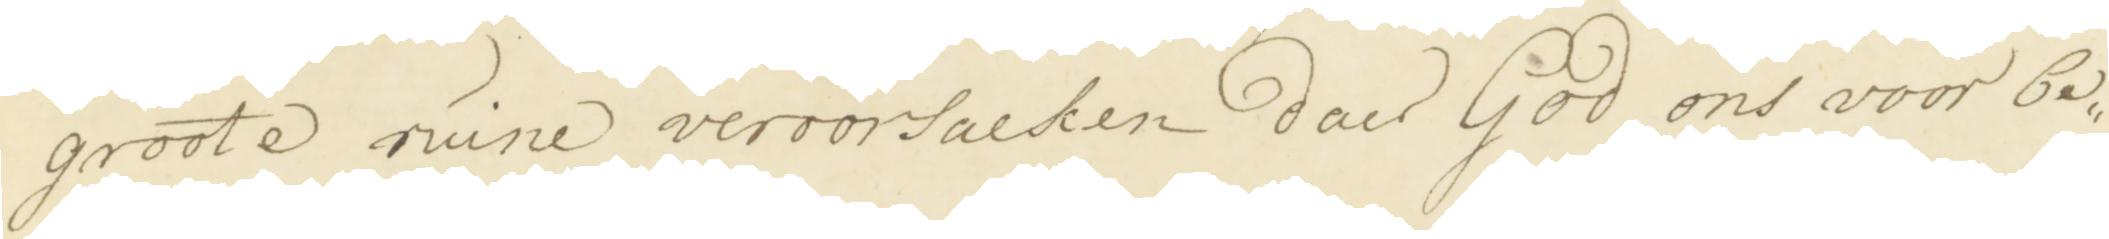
groote ruine veroorsaeken daer God ons voor be„
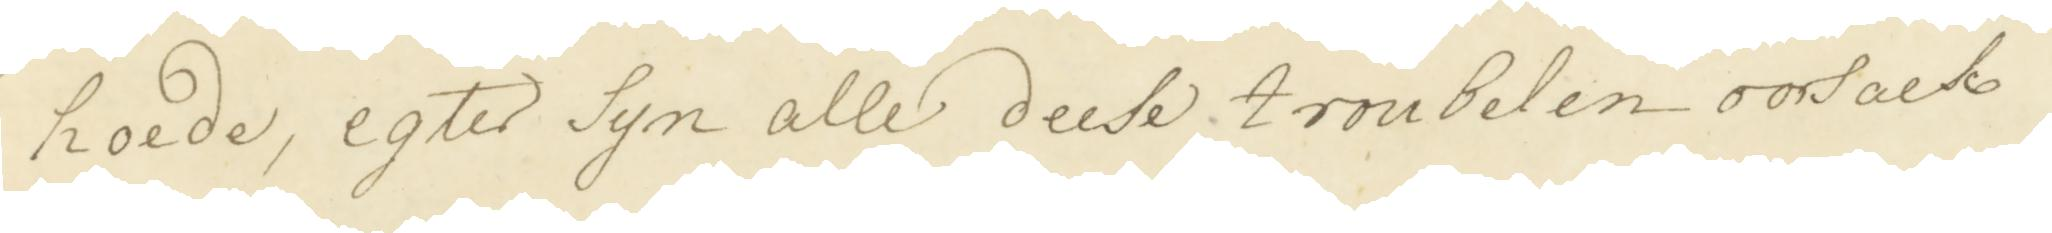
hoede, egter syn alle deese troubelen oorsaek
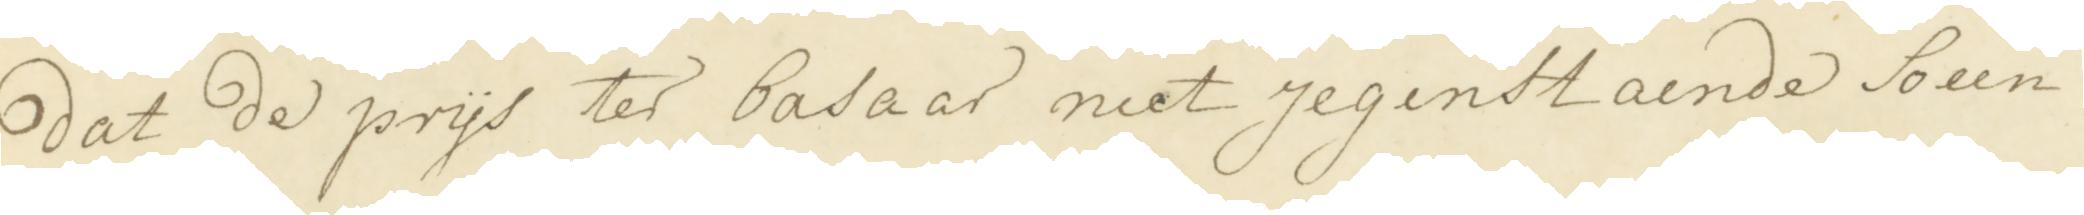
dat de prijs ter basaar niet jegenstaende so een
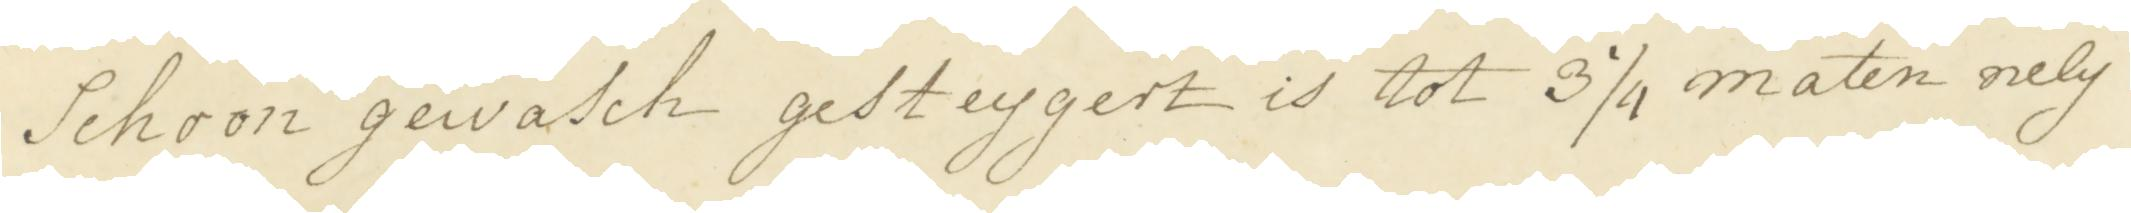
schoon gewasch gesteygert is tot 3¼ maten nely
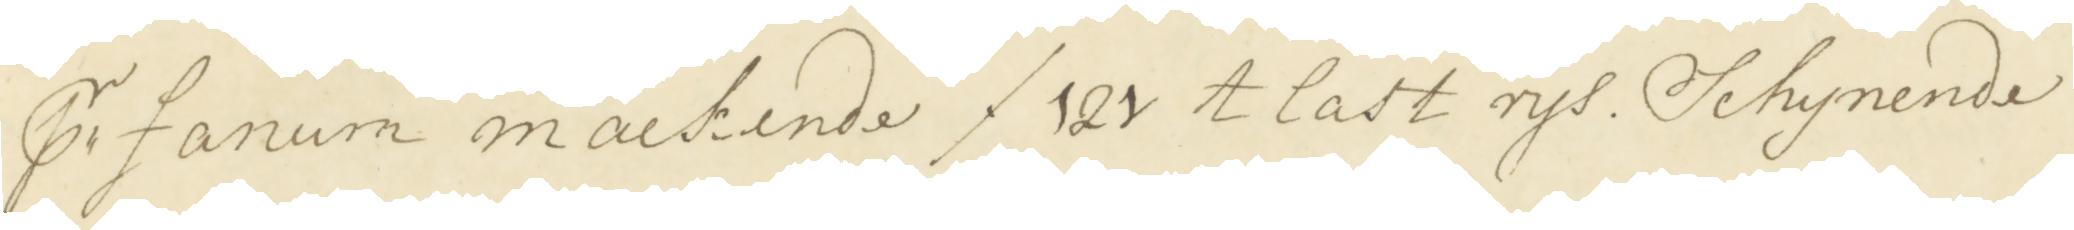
p„r fanum maekende ƒ 121 t last rys. Schynende
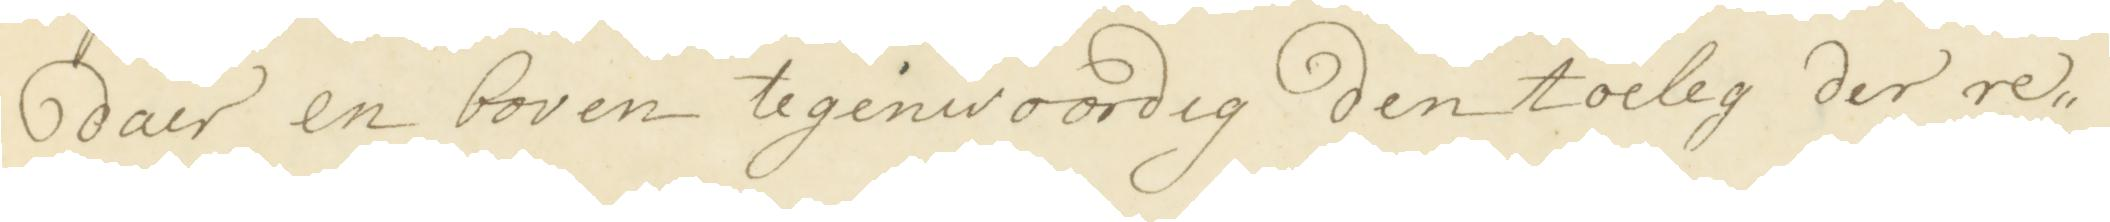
daer en boven tegenwoordig den toeleg der re„
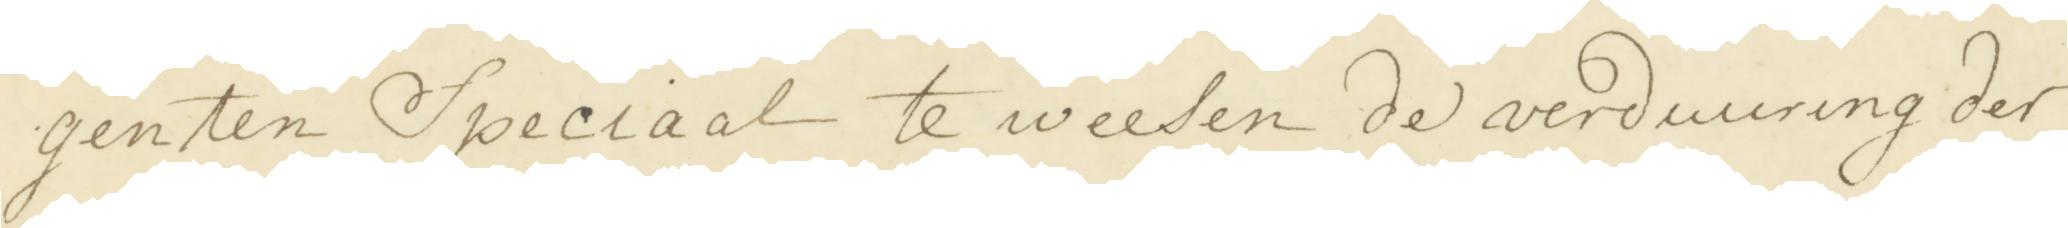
genten speciaal te weesen de verduuring der
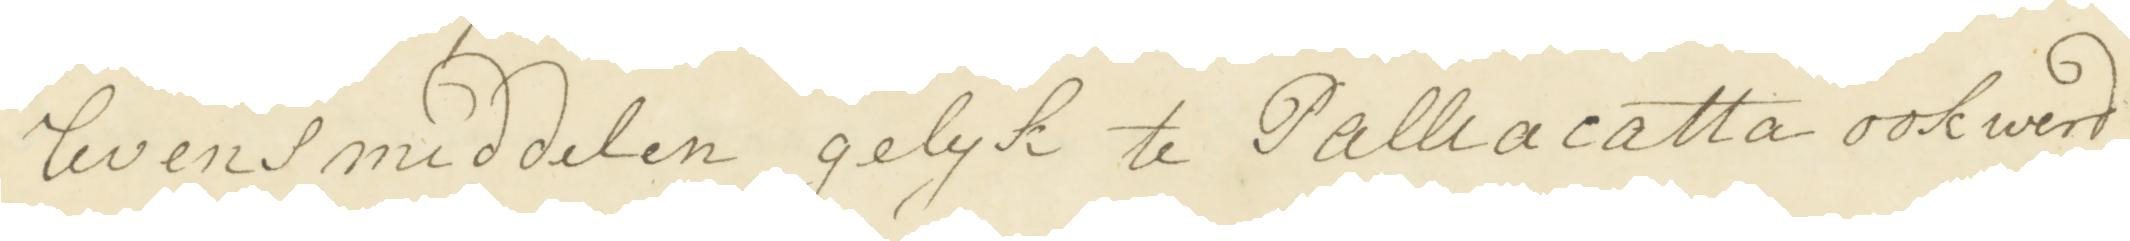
levensmiddelen gelyk te Palliacatta ook werd
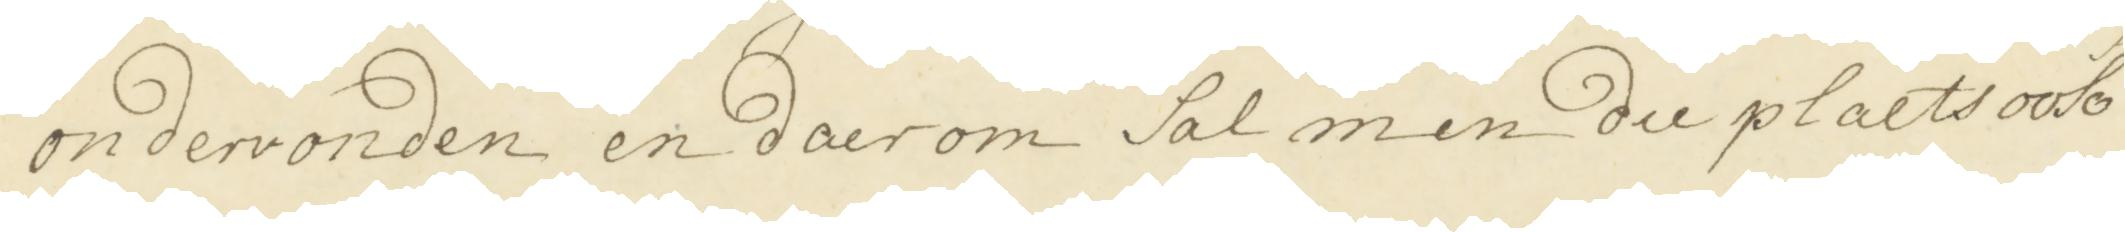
ondervonden en daerom sal men die plaets ook
